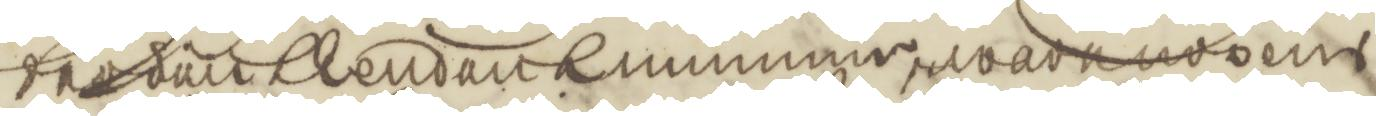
fredrick hendrick mumme, waernevens
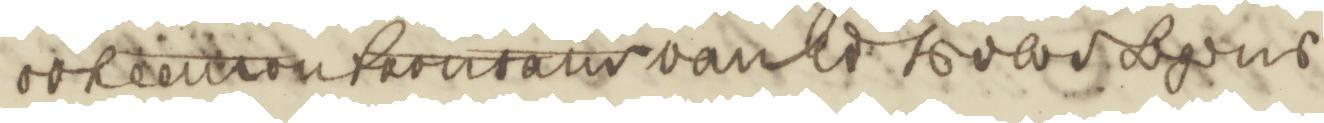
ook een confrontatie van Ed: tselve tegens
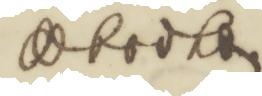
deboeken.
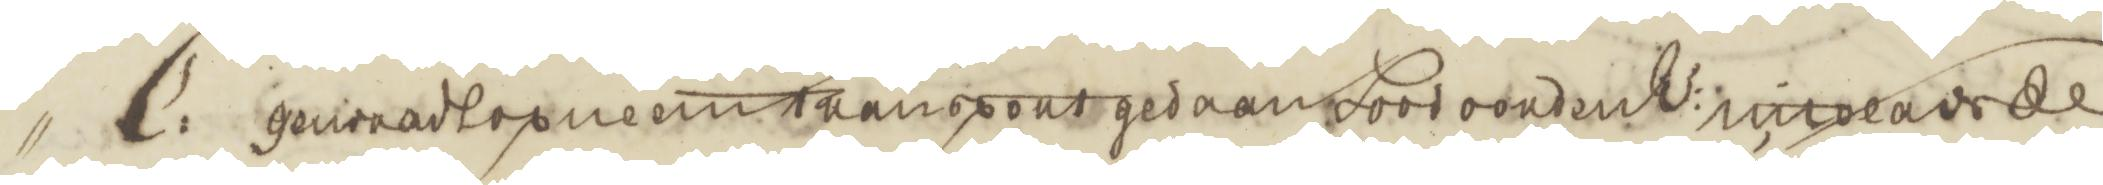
„ C: generael opneem transport gedaan sood oordenh: nicolaes de
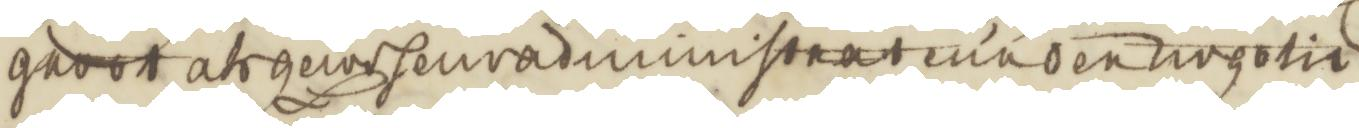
groot als gewesen administrateur der negotie
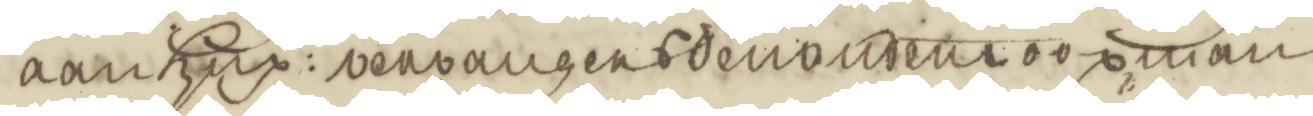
aan syn p:' vervangers den ondercoopman
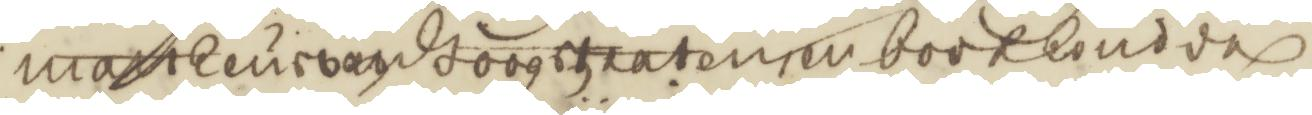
mattheus van Hoogstraten, en boekhouder
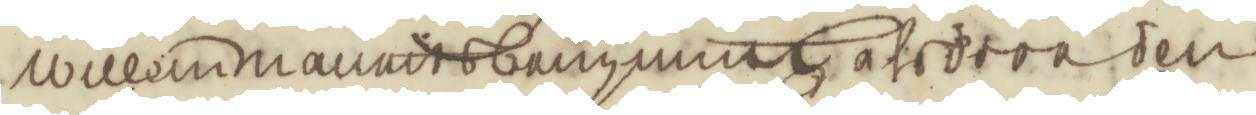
Willem maurits bruijninck als voor den
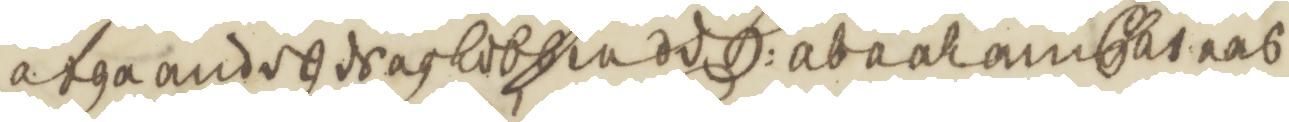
afgaande gesaghebber de E:' abaaham Patras
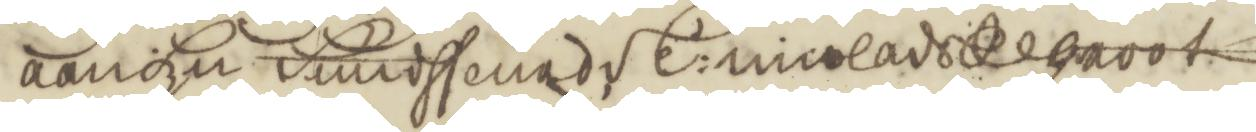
aan syn successeur de E: nicolaes de groot
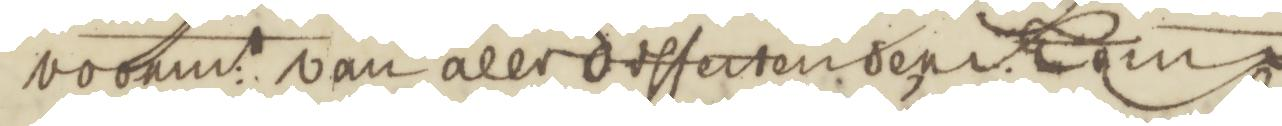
voorm:t van alle d'effecten der EComp:
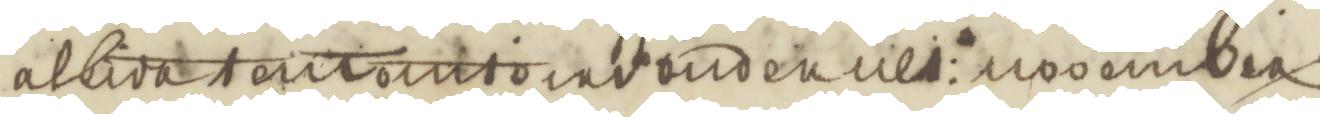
alhier ter comtoire onder ult:o november
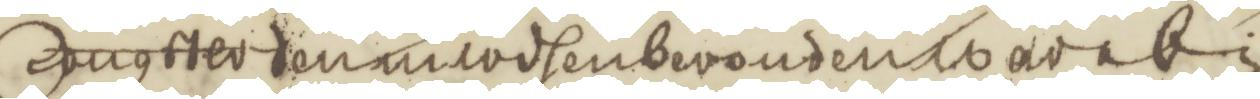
Iongstleden in wesen bevonden waerbij
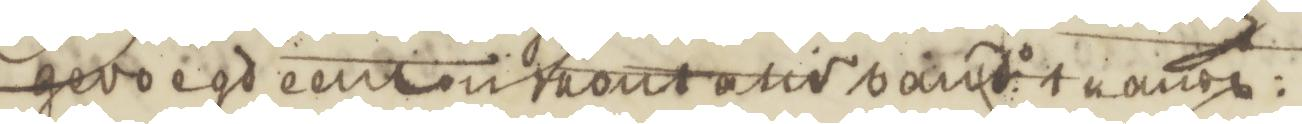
gevoegd een confrontatie van d:o transp:
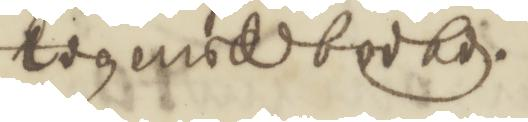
tegens de boeken.
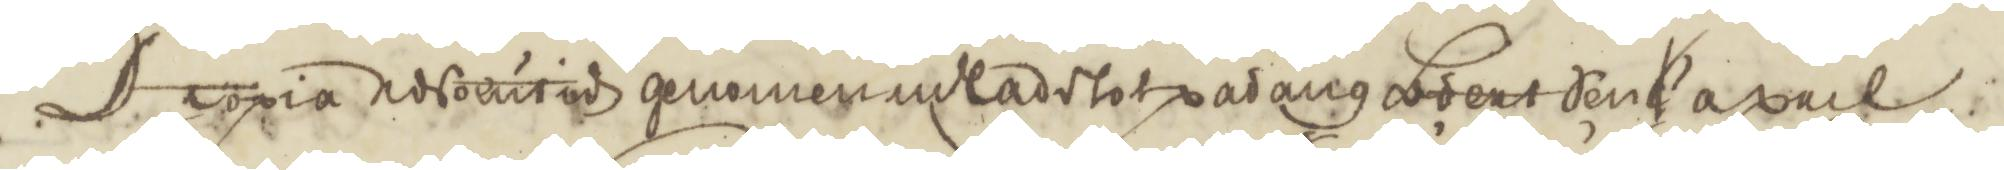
„D. copia resolutien genomen in rade tot padang sedert den 6' april
